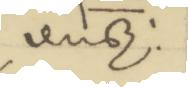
ensz:
